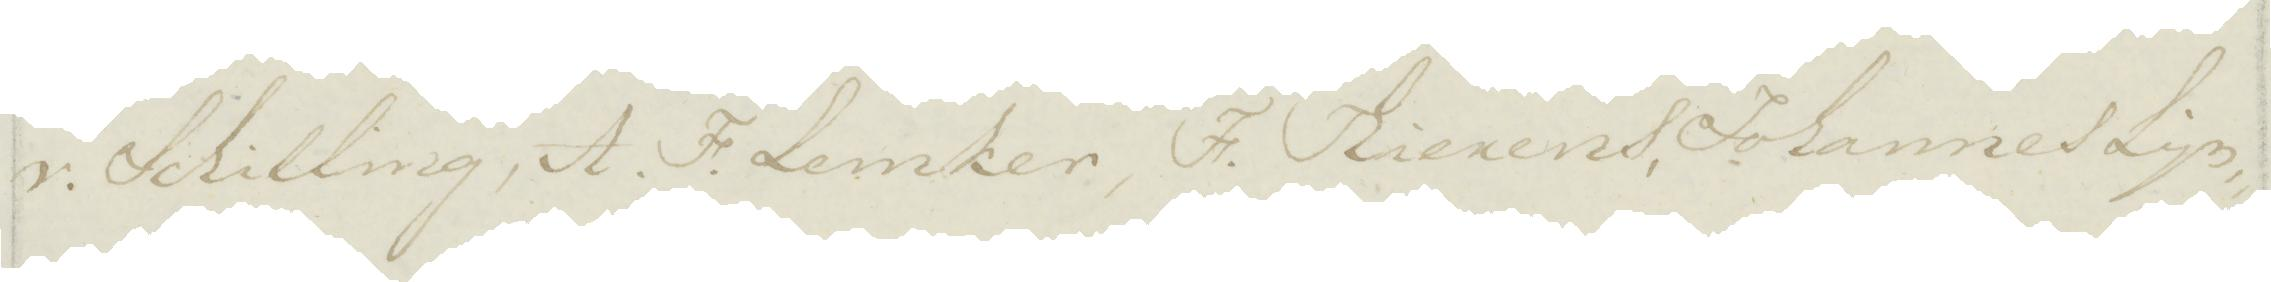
v. Schilling, A: F: Lenker, F. Thierens, Johannes Lijn„
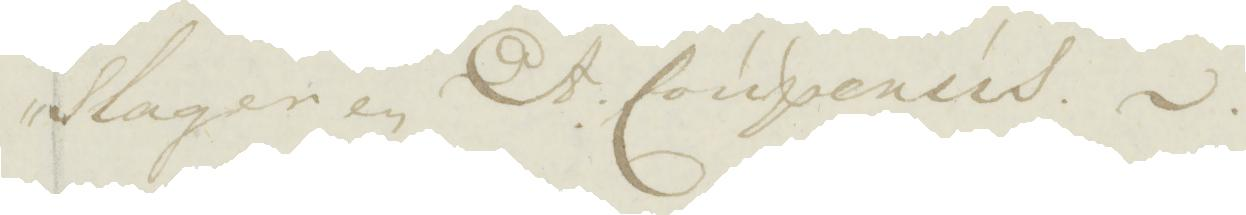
„slager en A. Couperus.
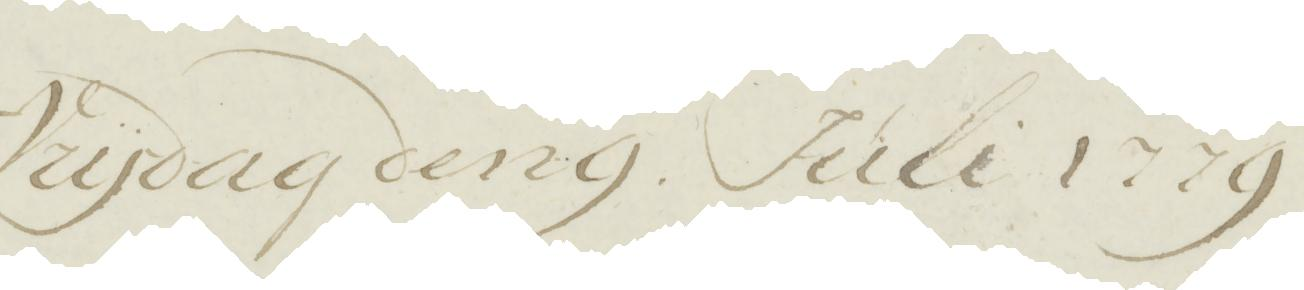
Vrijdag den 9. Juli 1779
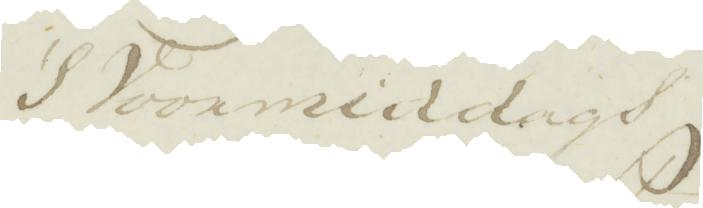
's Voormiddags
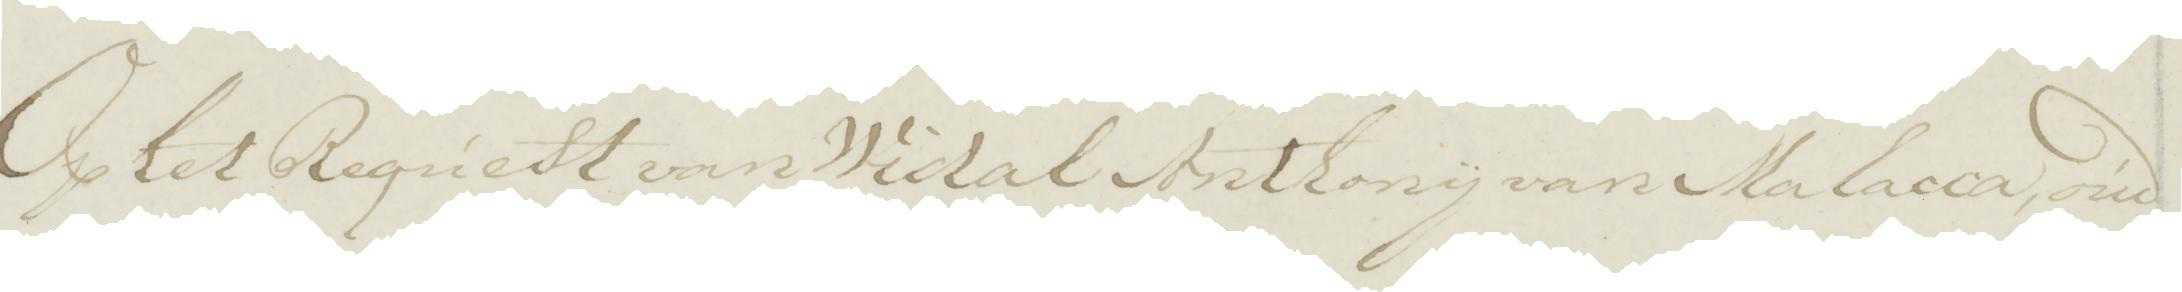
Op het Request van Widal Anthonij van Malacca, oud
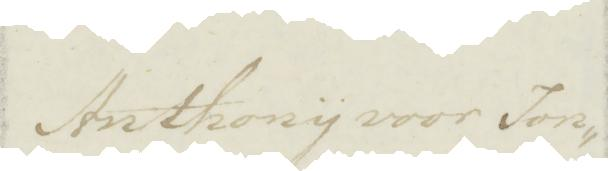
Anthonij voor Ion„
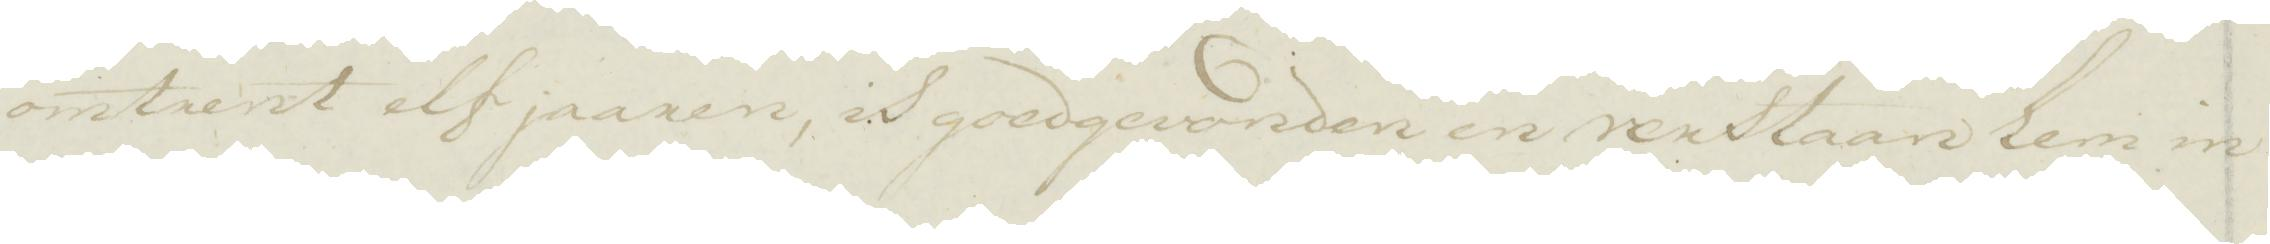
omtrent elf jaaren, is goedgevonden en verstaan hem in
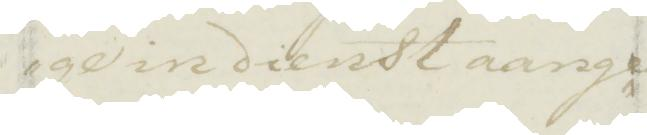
„ge in dienst aang„
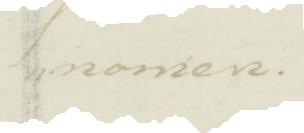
„nomen.
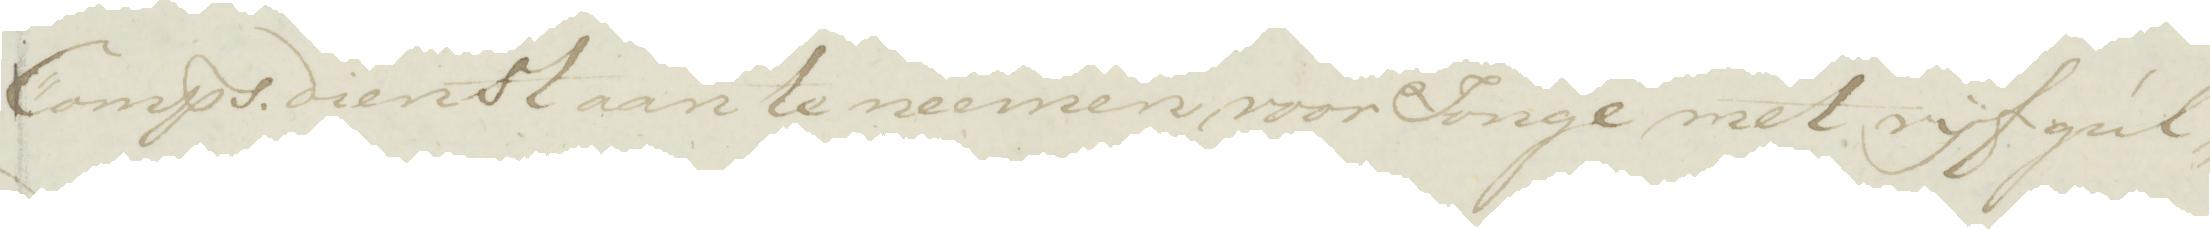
Comps. dienst aan te neemen, voor Ionge met vijf gul„
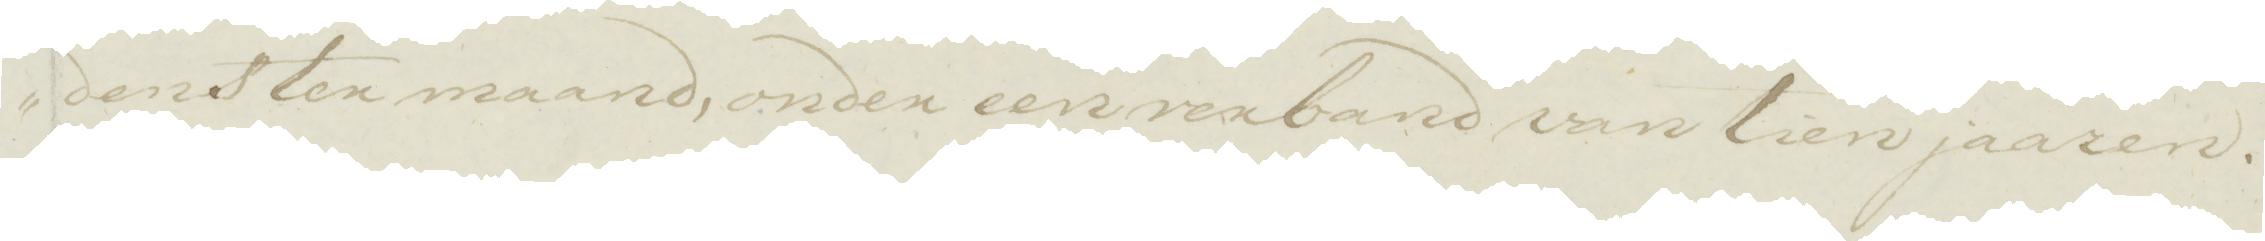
„dens ter maand, onder een verband van tien jaaren.
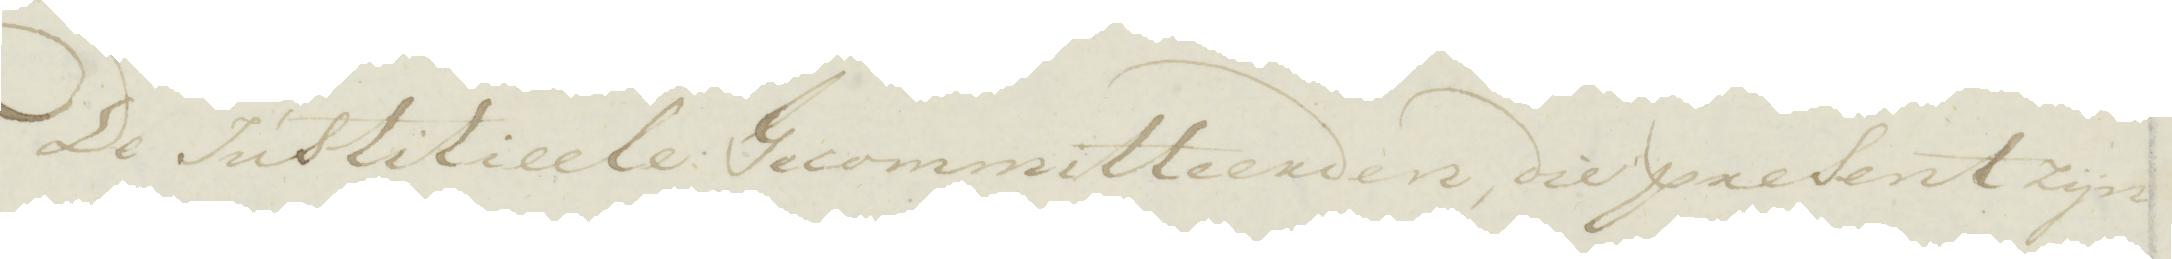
De Iustitieele Gecommitteerden, die present zijn
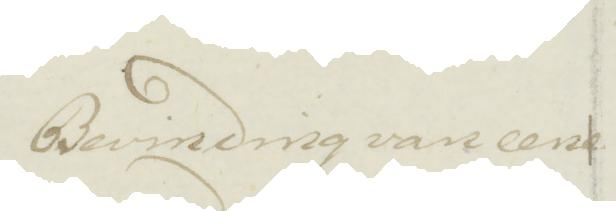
Bevinding van eene
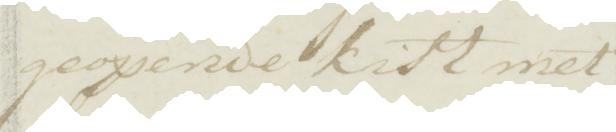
geopende kist met
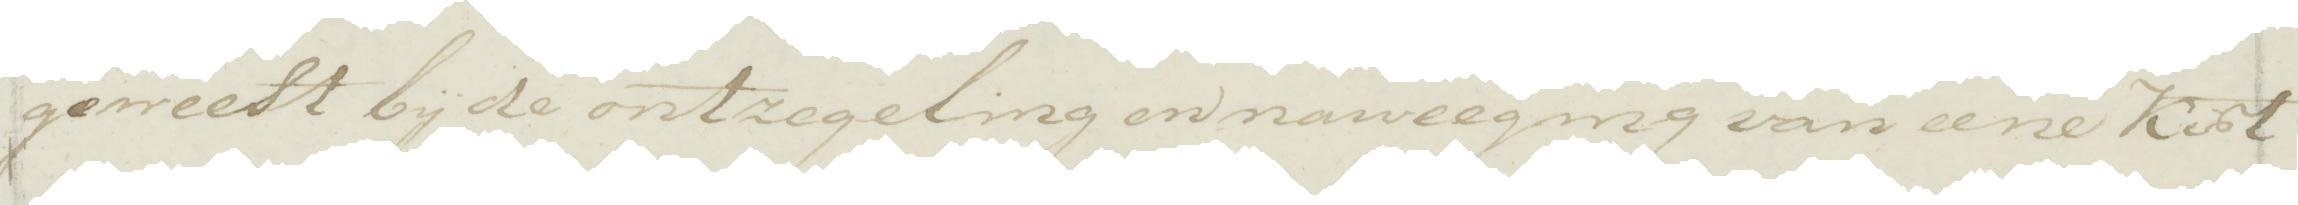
geweest bij de ontzegeling en naweeging van eene kist
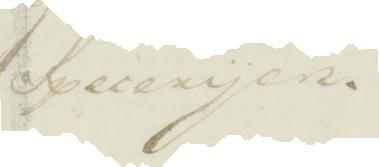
specerijen.
